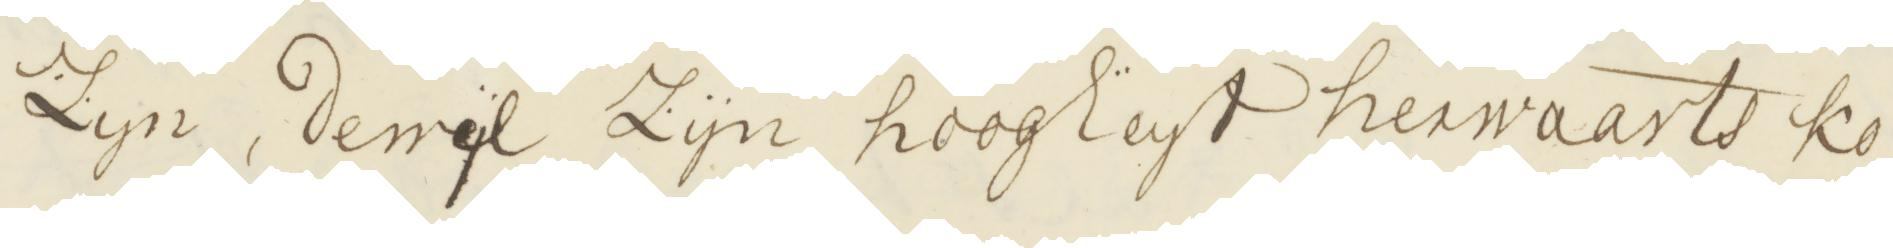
zijn, dewijl zijn hoogheijt herwaarts ko
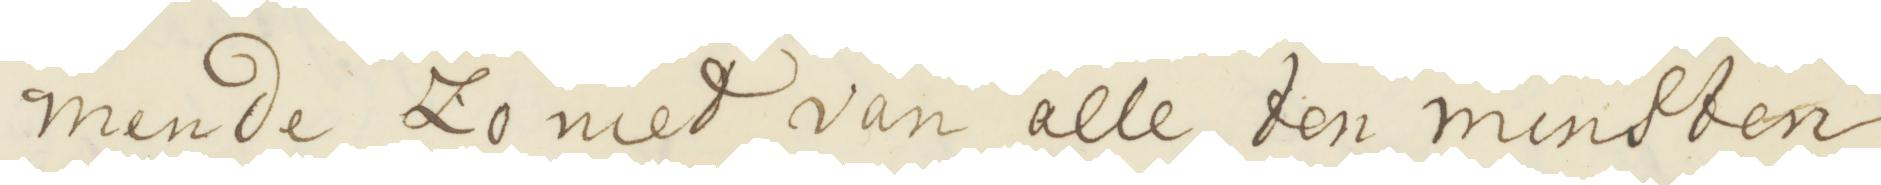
mende zo niet van alle, ten minsten
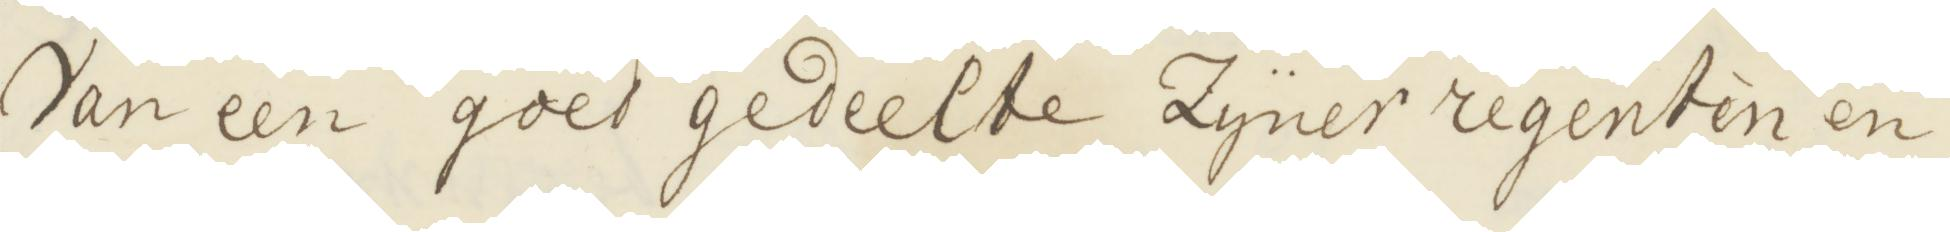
van een goed gedeelte zijner regenten en
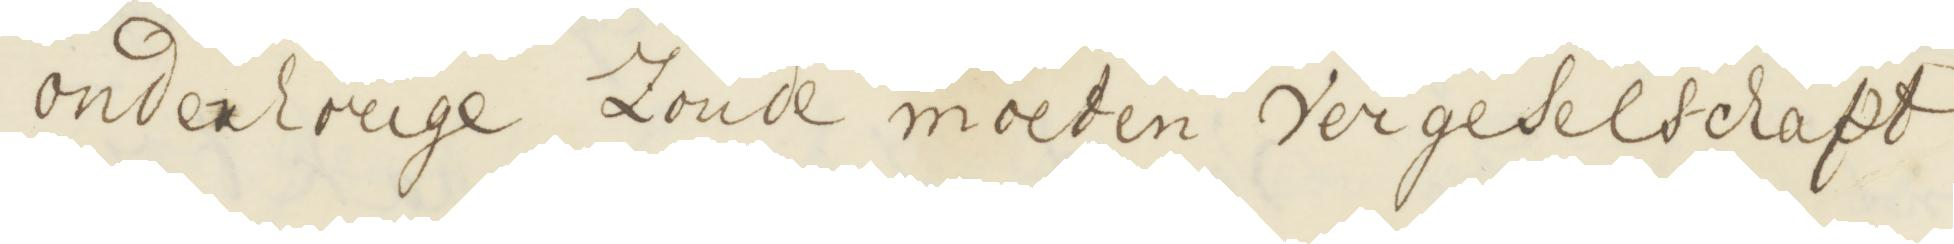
onderhorige zoude moeten vergeselschapt
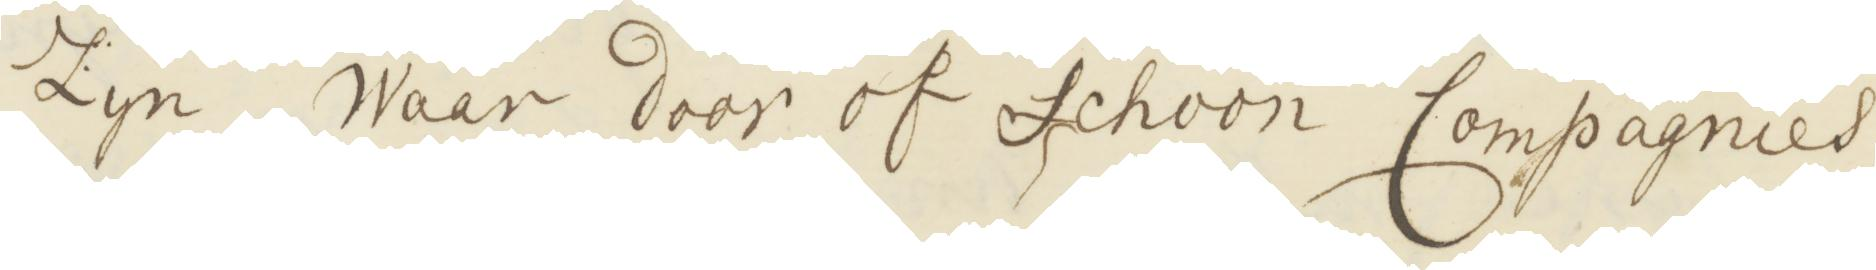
zijn, waar door of schoon Compagnies
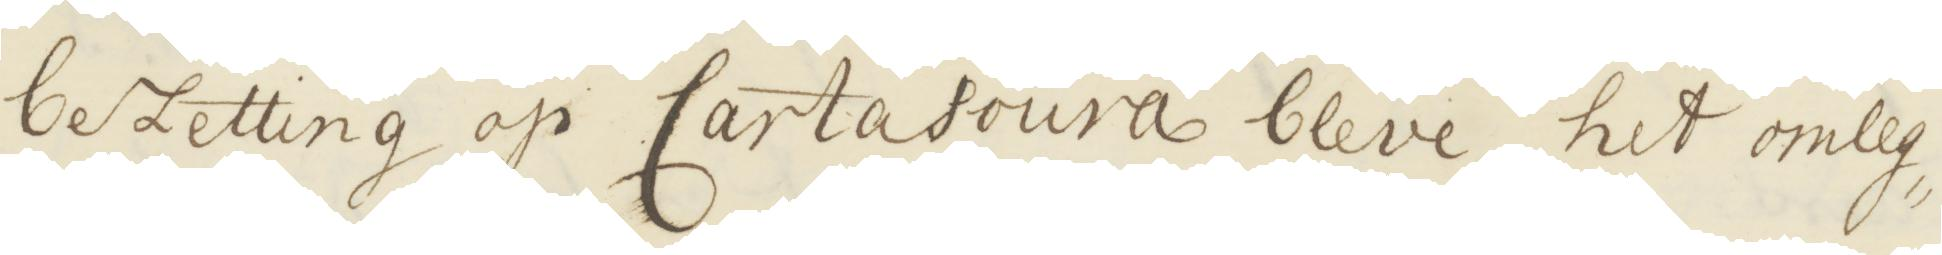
bezetting op Cartasoura bleve, het omleg„
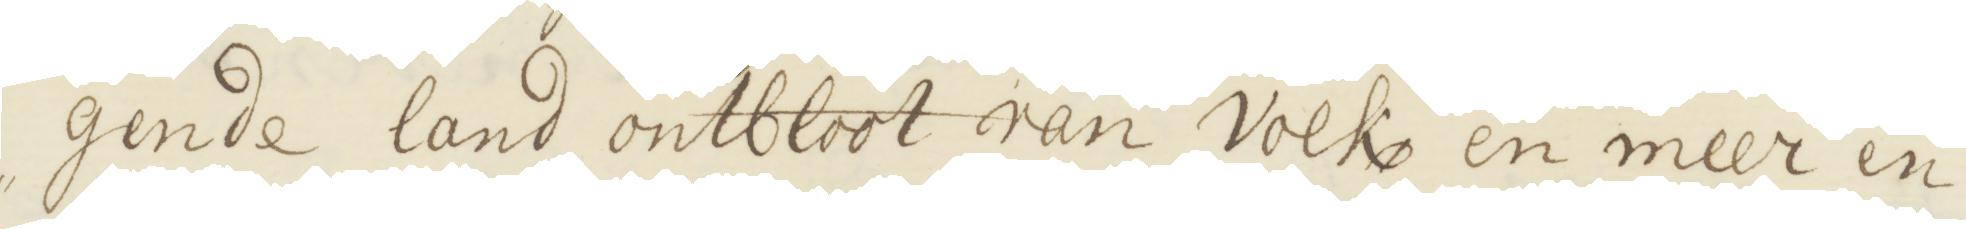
„gende land ontbloot van volk en meer en
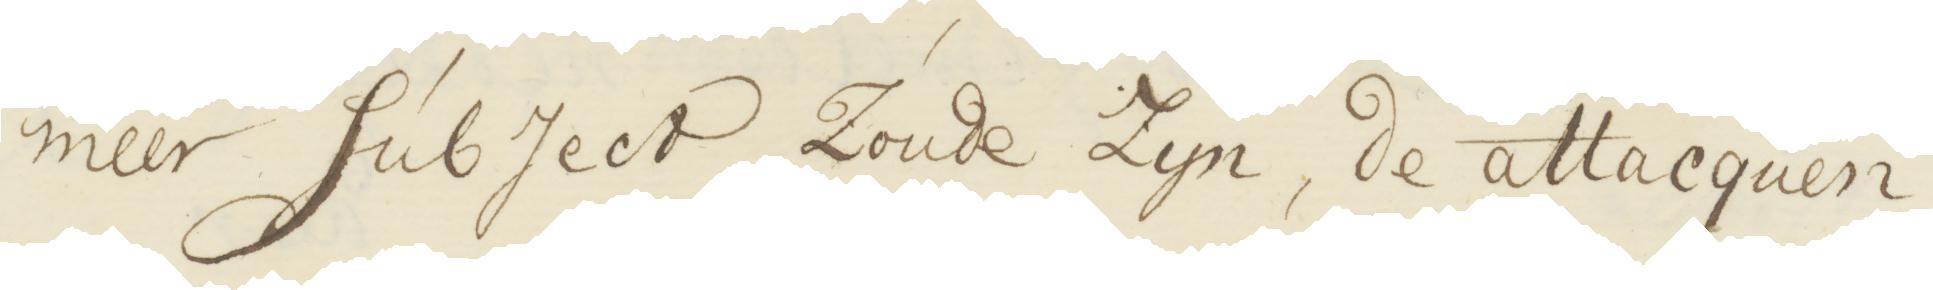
meer subject zoude zijn, de attacquen
